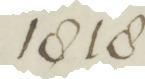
1818
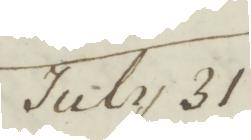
July 31
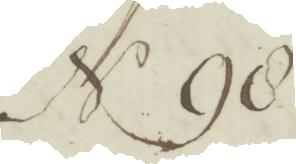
N. 98
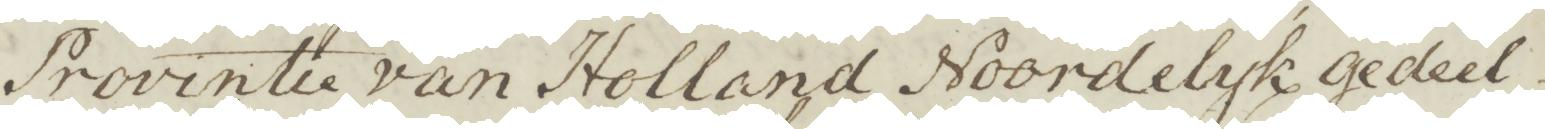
Provintie van Holland, Noordelyk gedeel
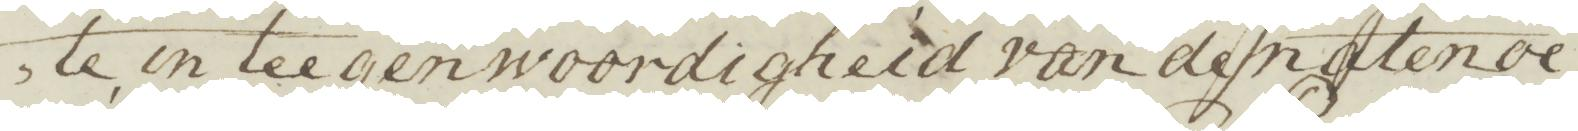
„te, in teegenwoordigheid van de natenoe
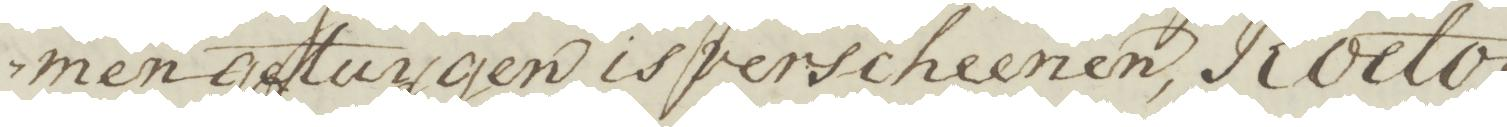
„men getuygen, is verscheenen, Roelof
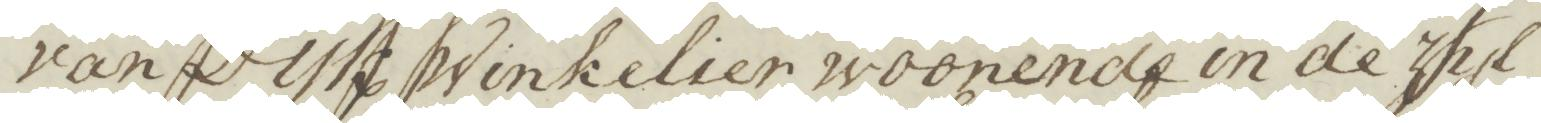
van Dyk Winkelier, woonende in de zyl
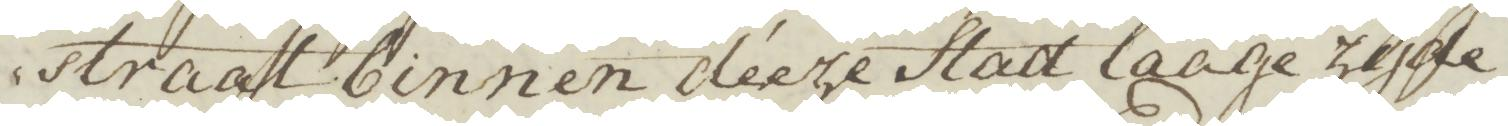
„straat binnen deeze stad laage zyde,
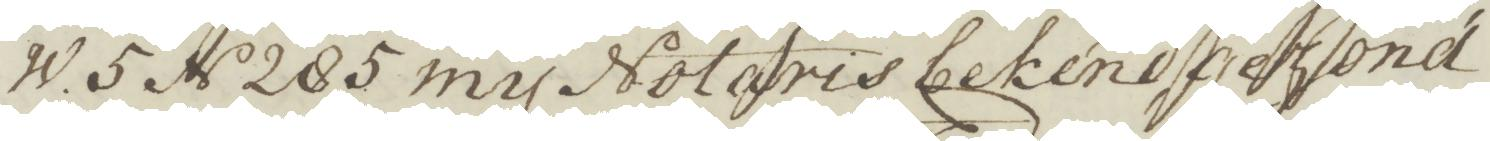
W: 5 N 285 my Notaris bekend gezond
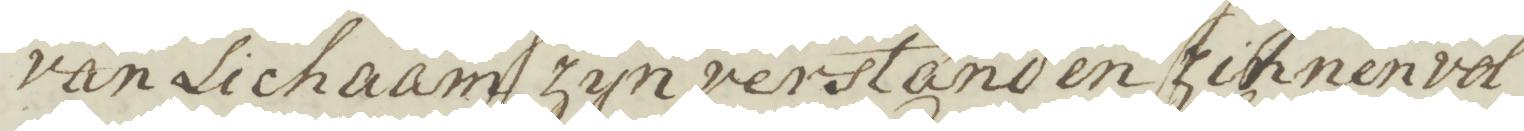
van Lichaam zyn verstand en zinnen vol
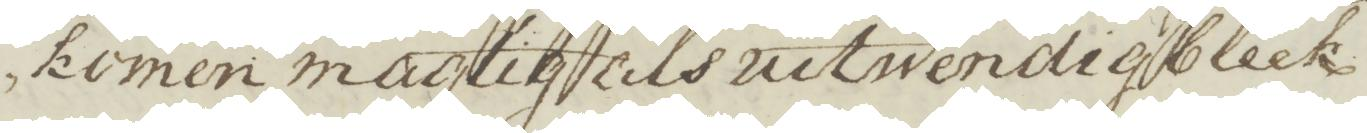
„komen magtig als uitwendig bleek
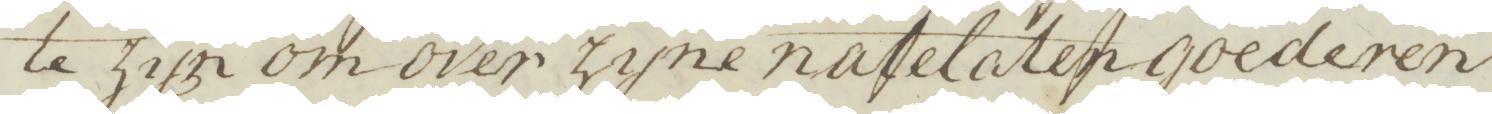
te zyn om over zyne natelaten goederen
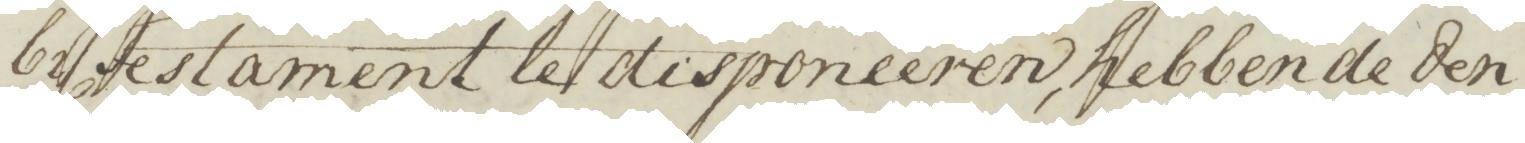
by Testament te disponeeren, hebbende den
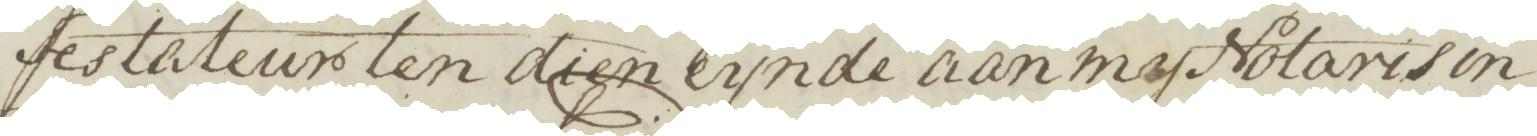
Testateur ten dien eynde aan my Notaris in
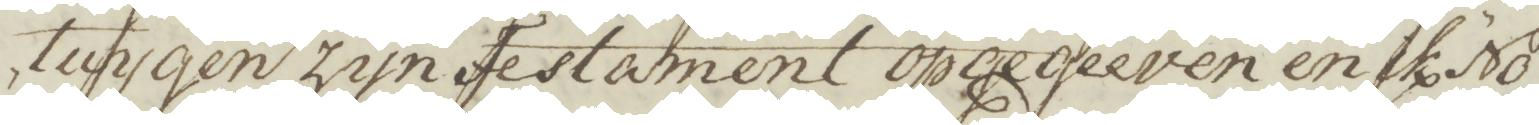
„tuijgen zyn Testament opgegeeven en ik No
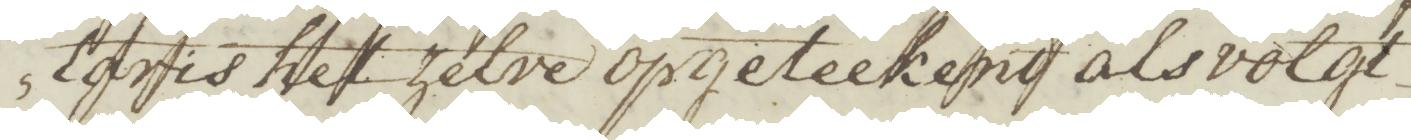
„taris het zelve opgeteekend als volgt
